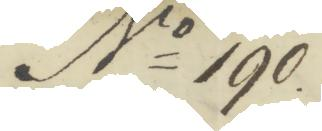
N=o 190
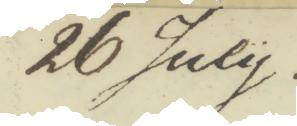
26 Julij.
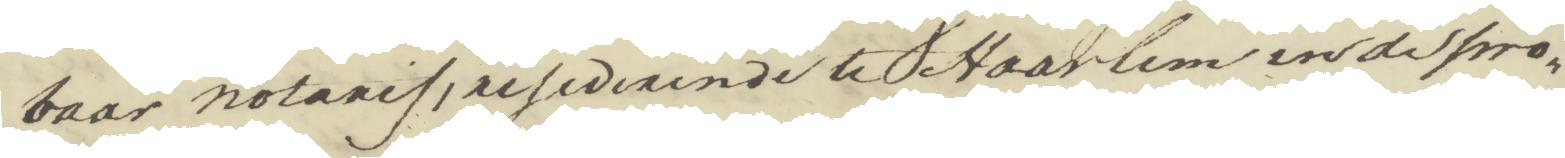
baar notaris, residerende te Haarlem in de pro„
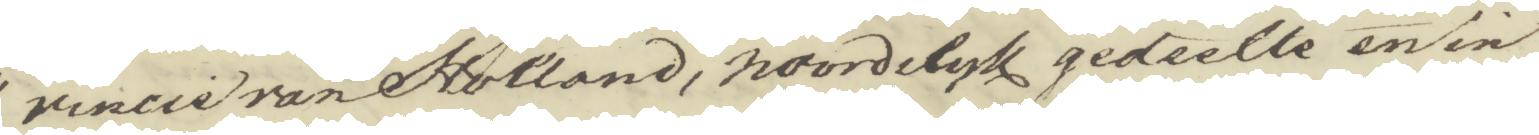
vincie van Holland, noordelyk gedeelte en in
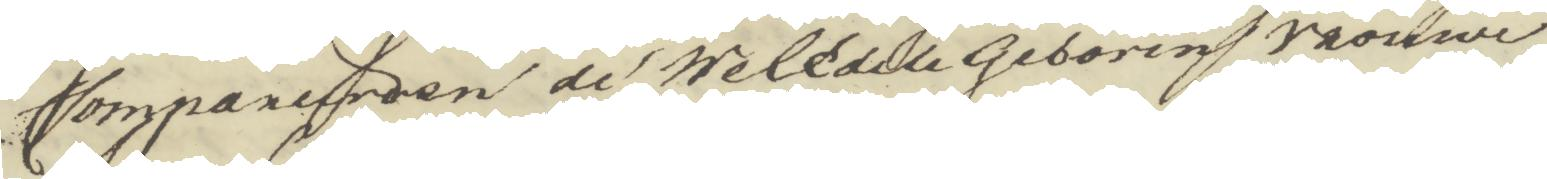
Compareerden de WelEdele geboren vrouwe
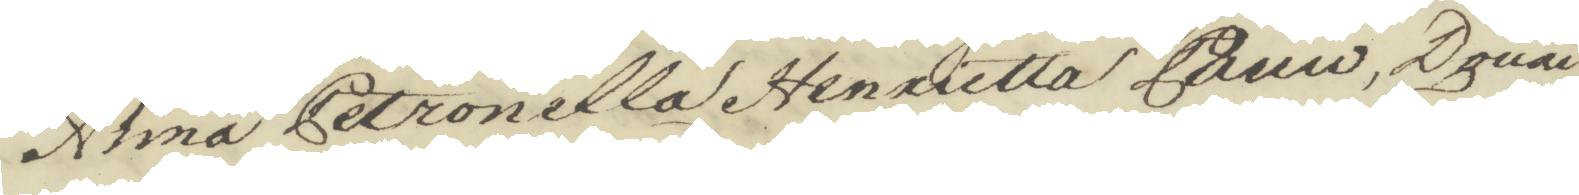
Anna Petronella Henrietta Pauw, Douai
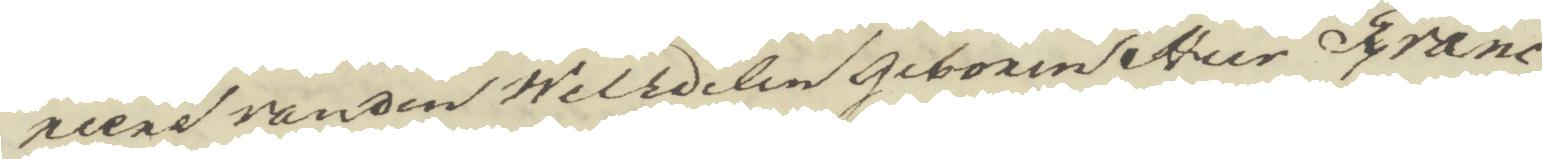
riere van den WelEdelen geboren Heer Franc
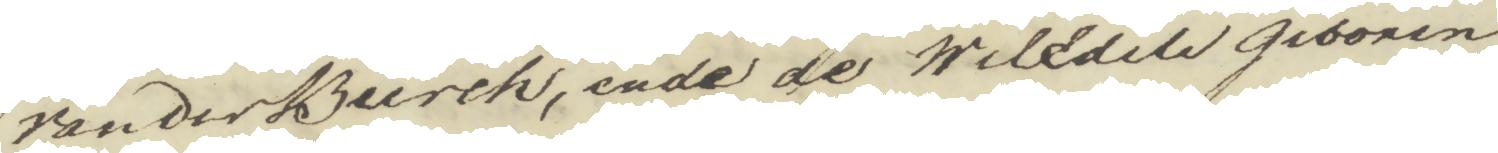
van der Burch, ende de WelEdele geboren
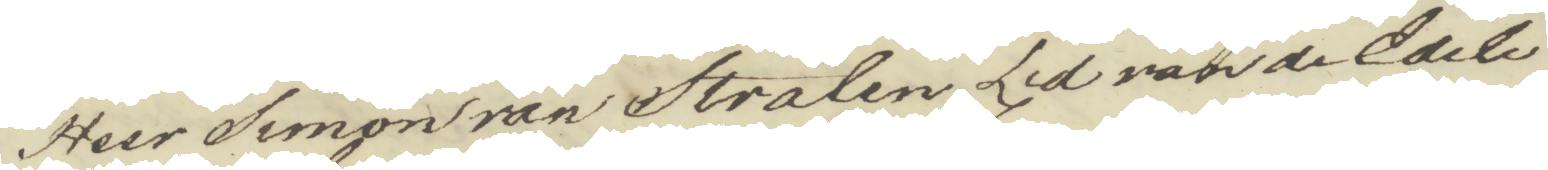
Heer Simon van Stralen, Lid van de Edele
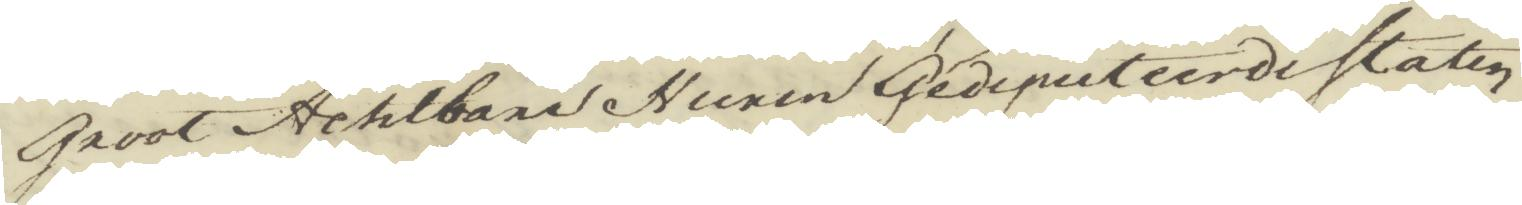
Groot Achtbare Heeren Gedeputeerde staten
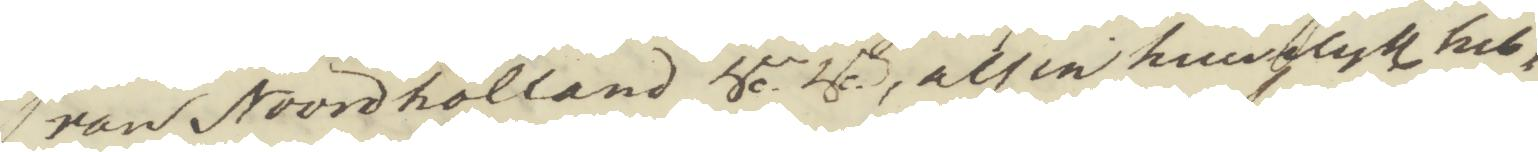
van Noord holland etc. etc., als in huwelyk heb
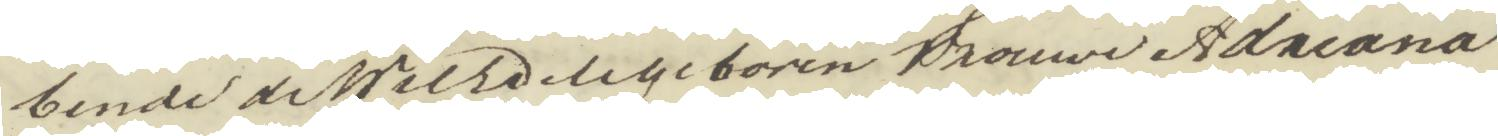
bende de WelEdele geboren Vrouwe Adriana
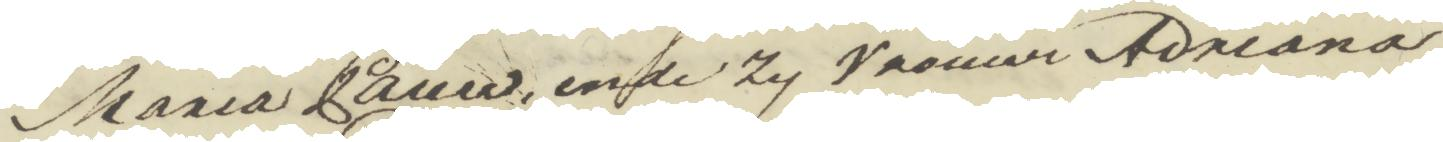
Maria Pauw, en de Zy Vrouwe Adriana
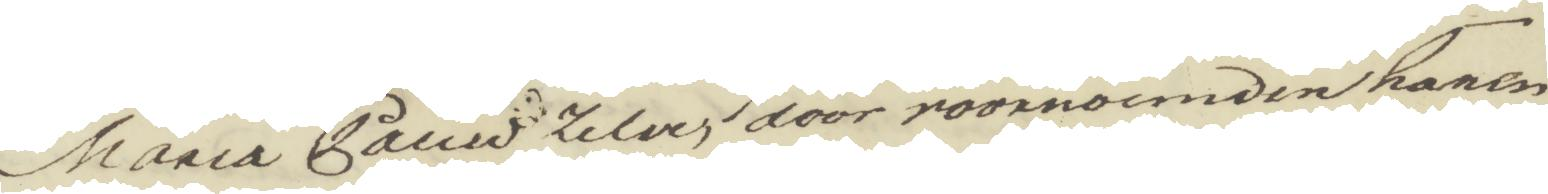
Maria Pauw zelve, door voornoemden haren
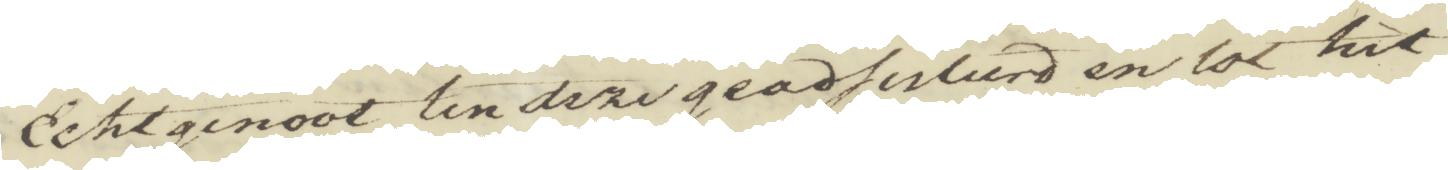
Echtgenoot ten deze geadsisteerd en tot het
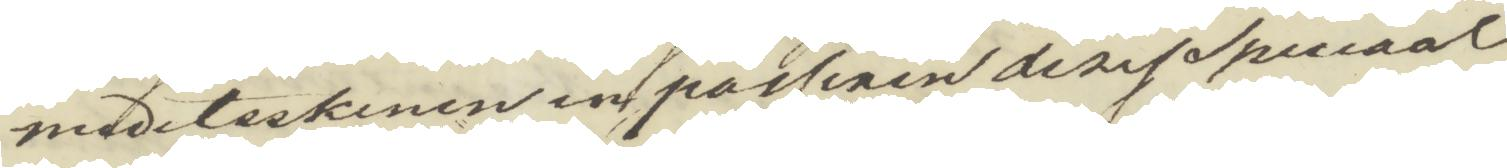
mede teekenen in passeren dezes speciaal
